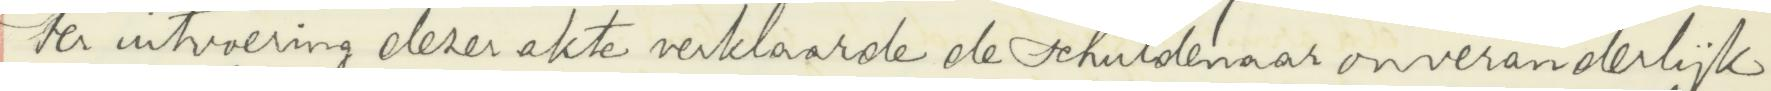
Ter uitvoering dezer akte verklaarde de schuldenaar onveranderlijk
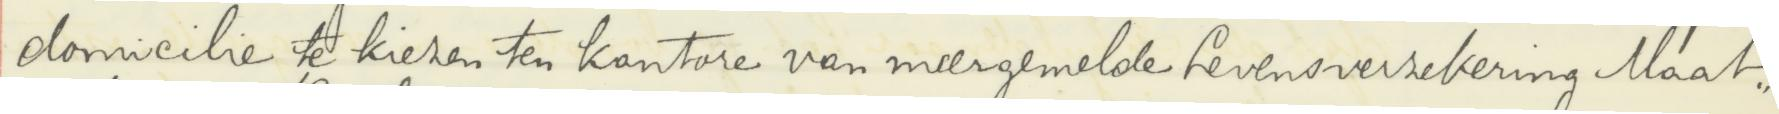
domicilie te kiezen ten kantore van meergemelde Levensverzekering Maat„
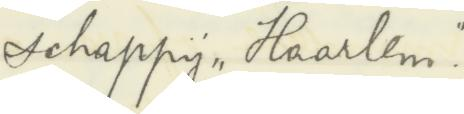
schappij „Haarlem"
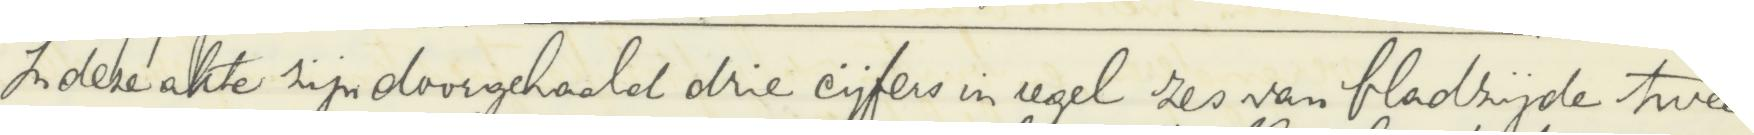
In deze akte zijn doorgehaald drie cijfers in regel zes van bladzijde twee
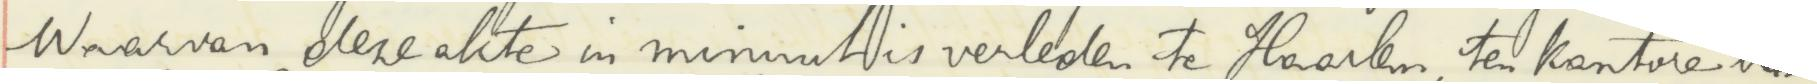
waarvan deze akte in minuut is verleden te Haarlem, ten kantore ven
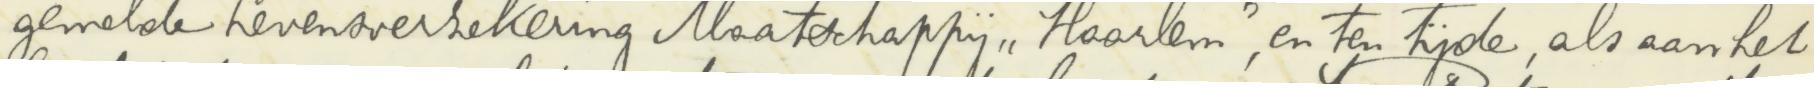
gemelde Levensverzekering Maatschappij „Haarlem", en ten tijde, als aan het
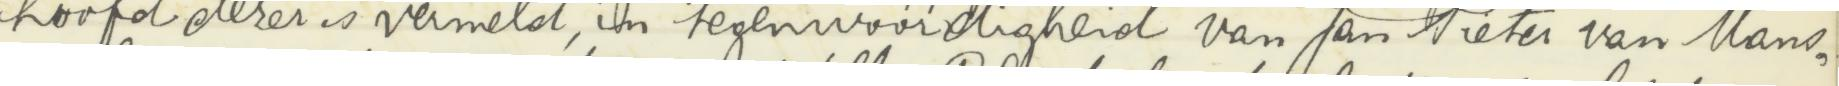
hoofd dezer is vemeld, in tegenwoordigheid van Jan Pieter van Mans„
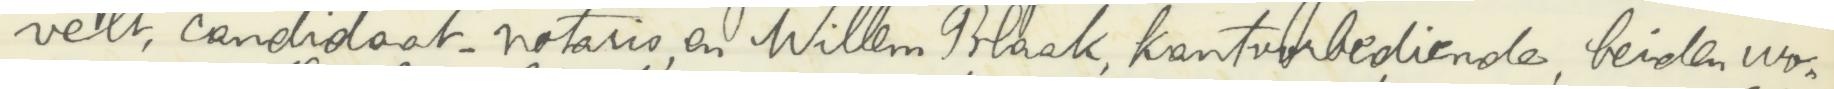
velt, candidaat- notaris en Willem Blaak, kantorbediende, beiden wo„
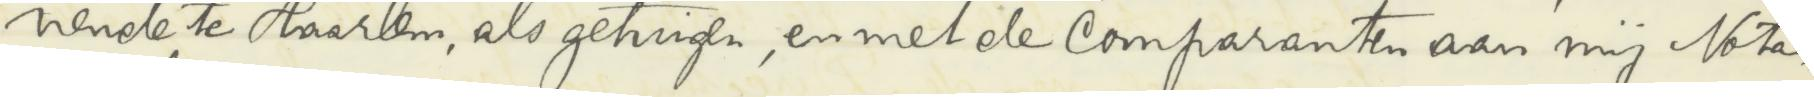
nende te Haarlem, als getuigen, en met de Comparanten aan mj Nota„
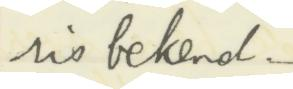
is bekend.
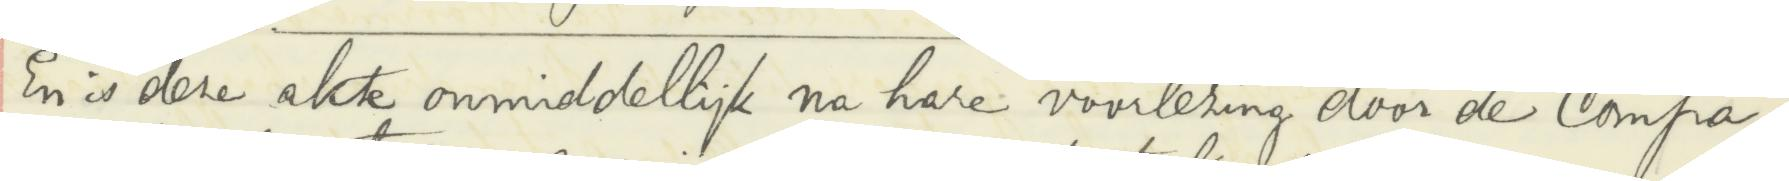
En is deze akte onmiddellijk na hare voorlezing door de Compa
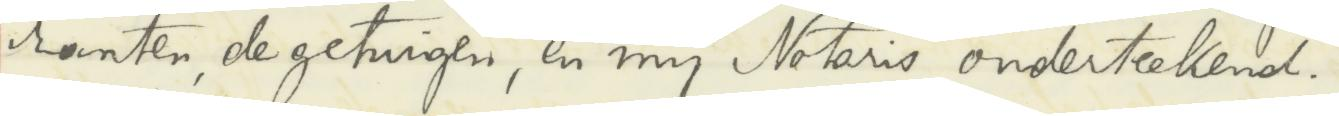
ranten, de getuigen, en mij Notaris onderteekend.
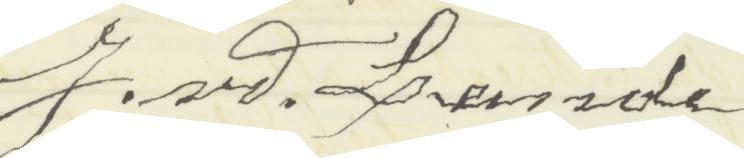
J. vd. Lande
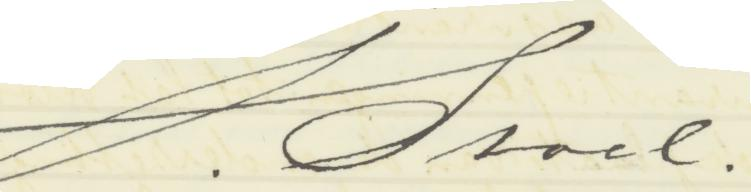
J. Stoel.
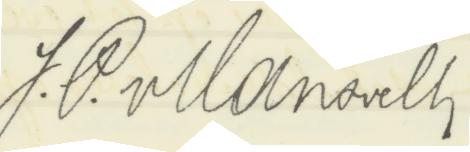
J: P: vMansvelt
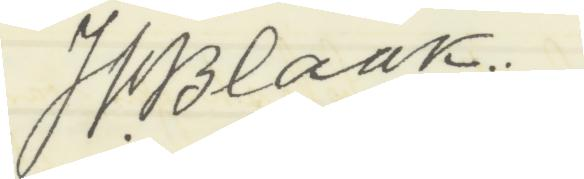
JWBlaak..
